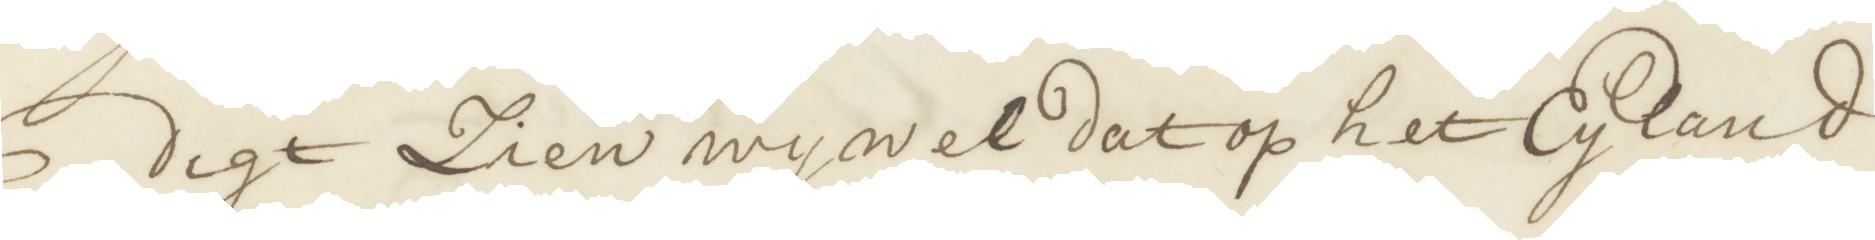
digt zien wy wel dat op het Eyland
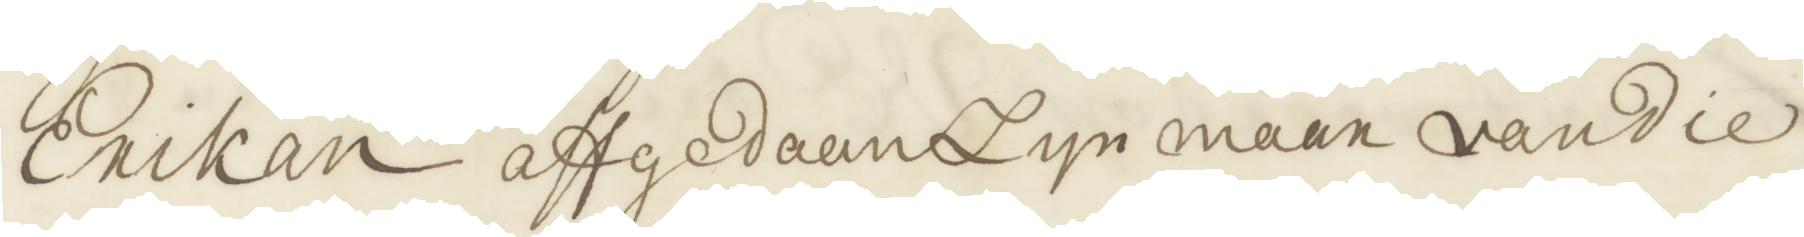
Erikan affgedaanzyn maar vandie
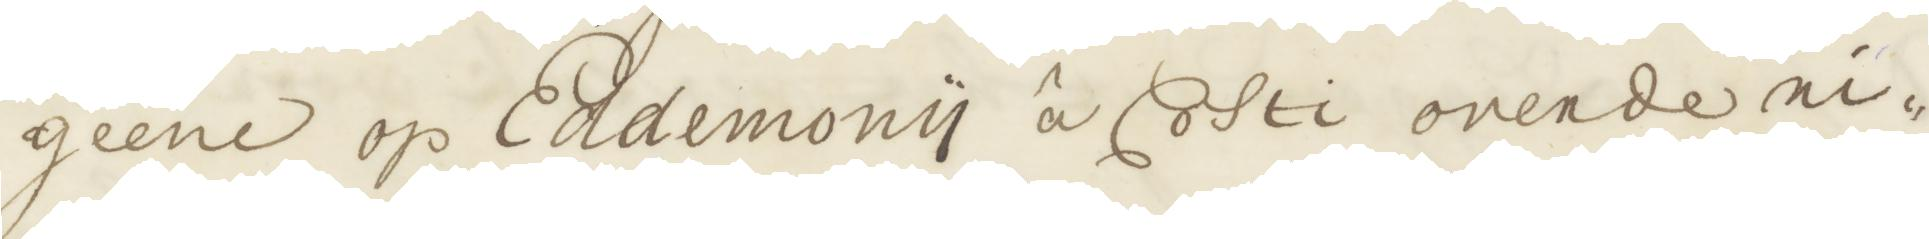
geene op Eddemony â Costi overde ri„
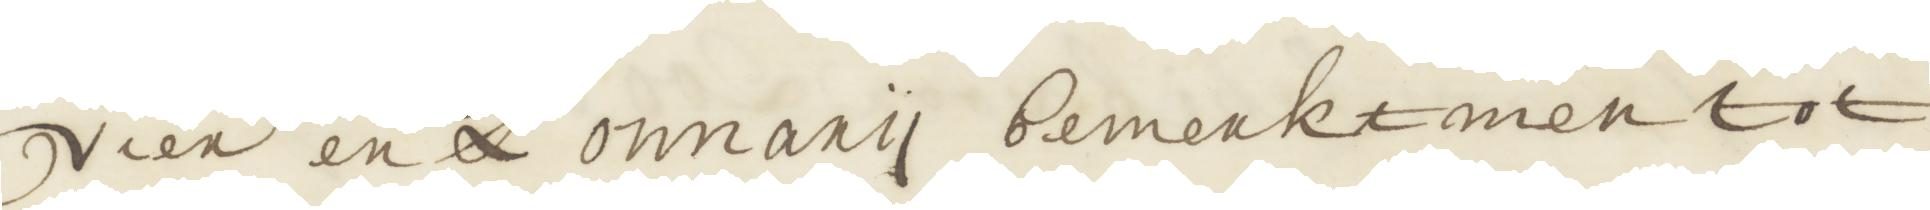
vier en „tot „Ponnarij bemerkt men tot
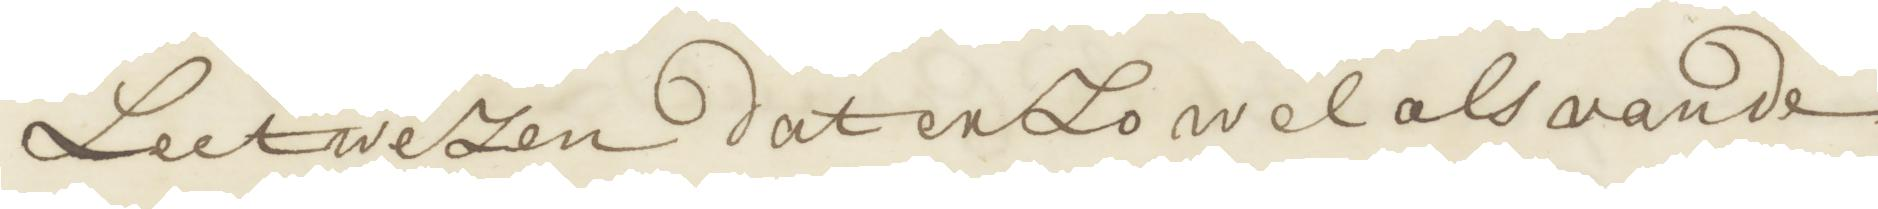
leetwezen dat erzo wel als vande
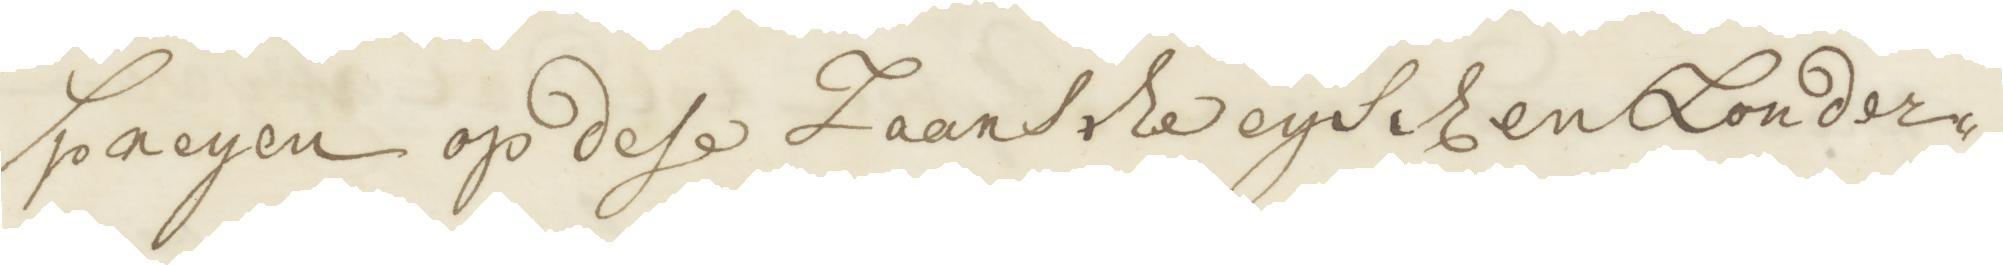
spreyen op dese Iaarsche eyschen zonder„
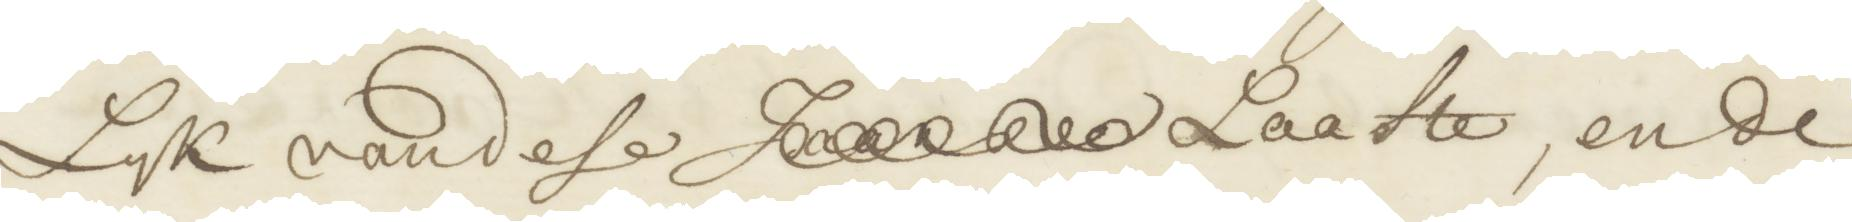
lyk vandese Jaar de Laaste, en de
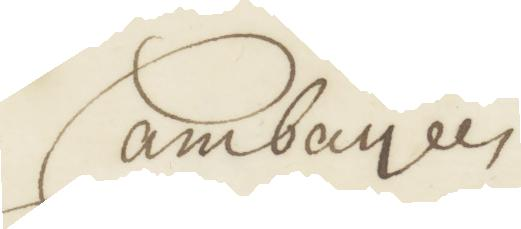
Cambayen
